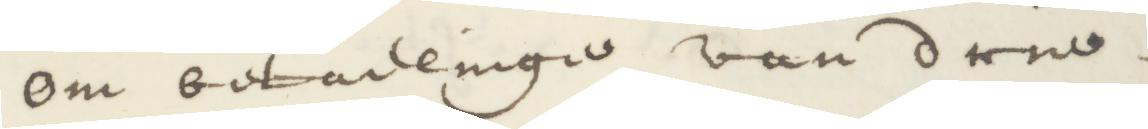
om betaelinge van drie
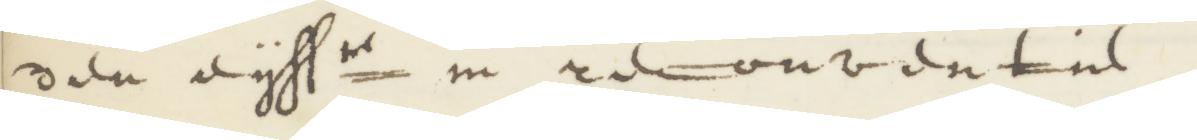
der eijss=r in reconventie
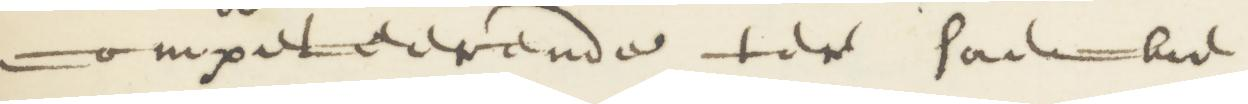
competeerende ter saecke
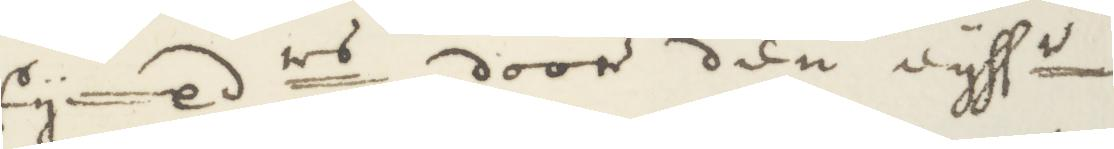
Rijcxd=rs door den eijss=r
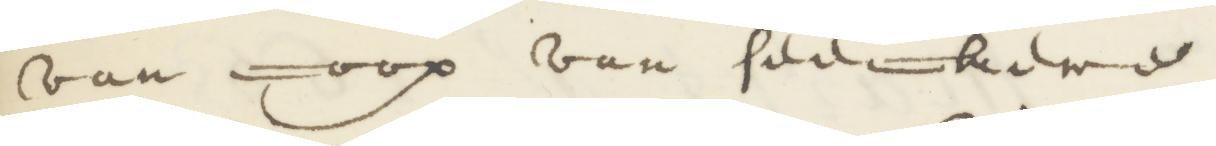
van coop van seeckere
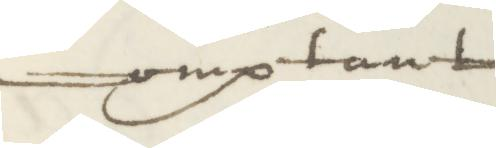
Comptant
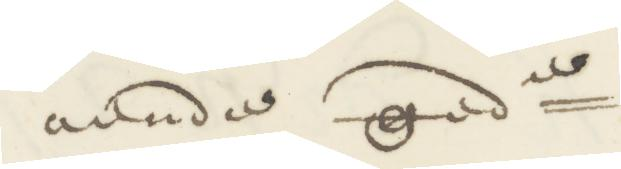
aen de ged=te
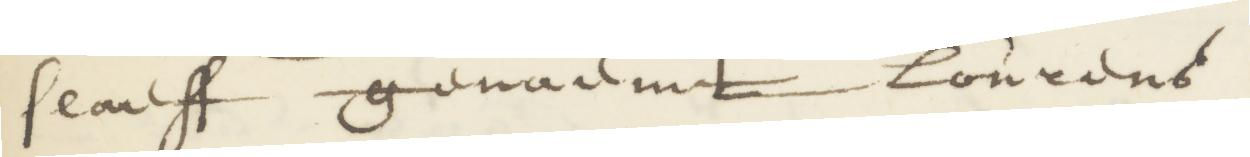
slaeff genaemt Lourens
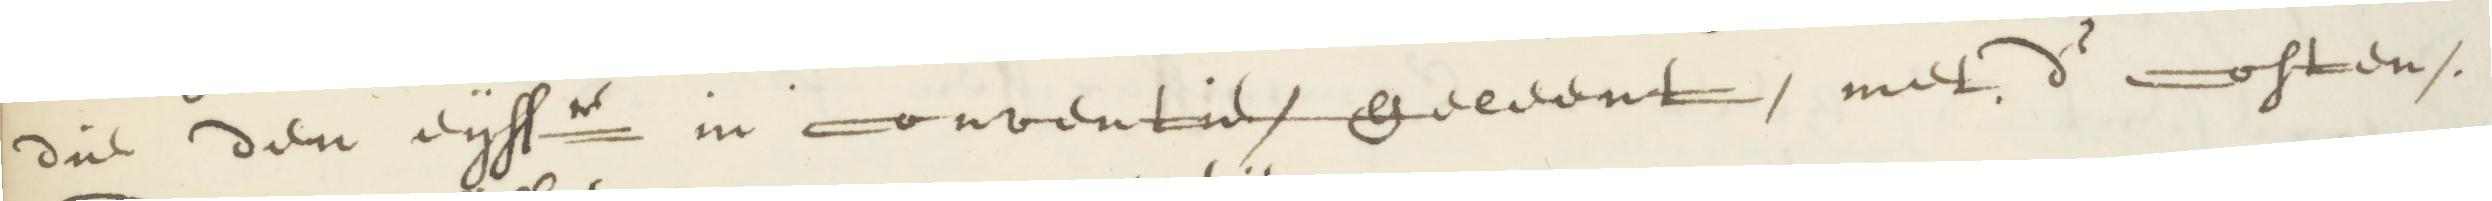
die den eijss=r in conventie, geleent, met d’ costen/.
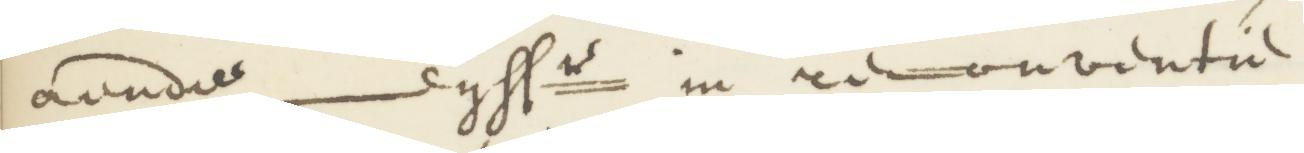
aende eijss=r in reconventie
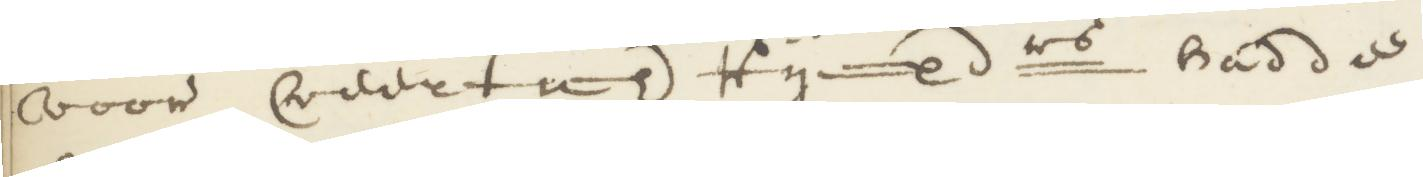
voor veertich Rijcxd=rs hadde
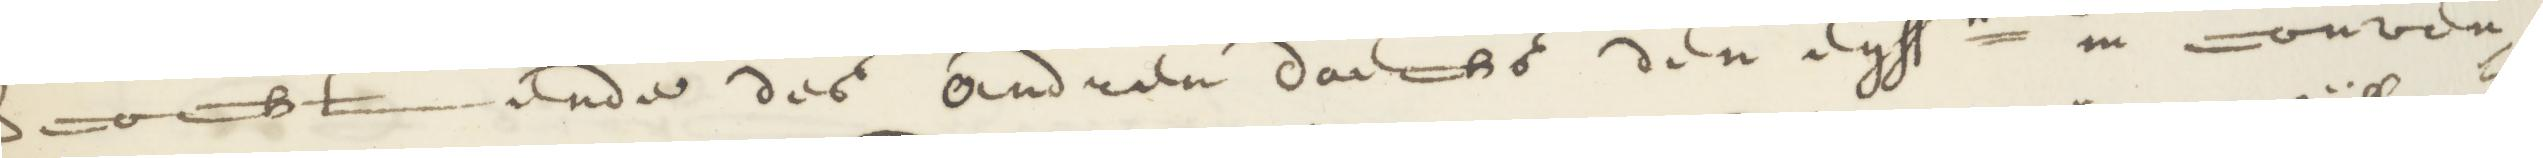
vercocht ende des andren daechs den eijss=r in conven
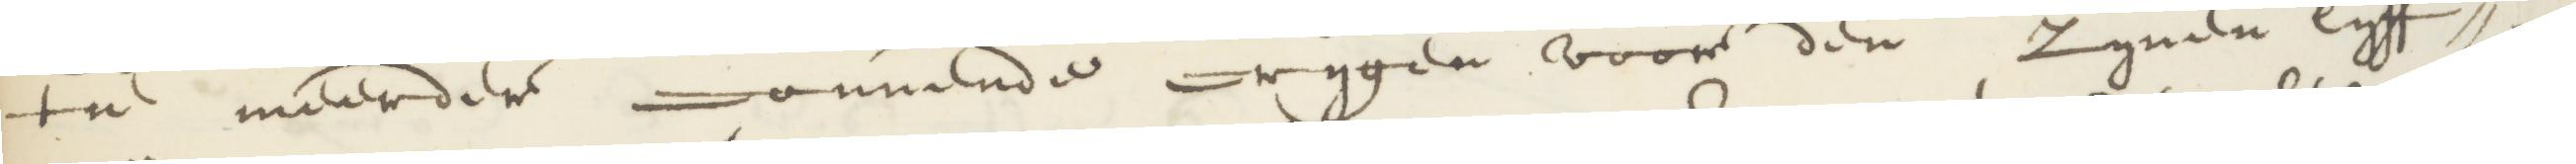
tie meerder connende crijgen voor den zijnen lijff„—
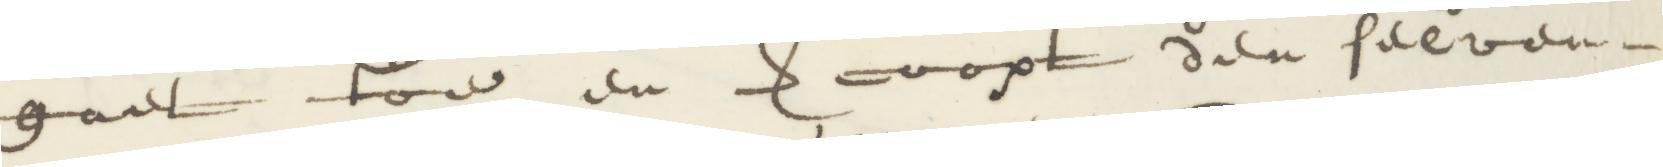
goet toe en vercoopt den selven
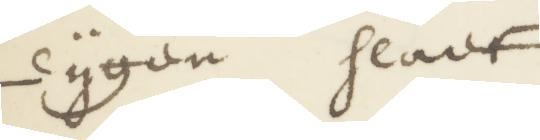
eijgen slaeff
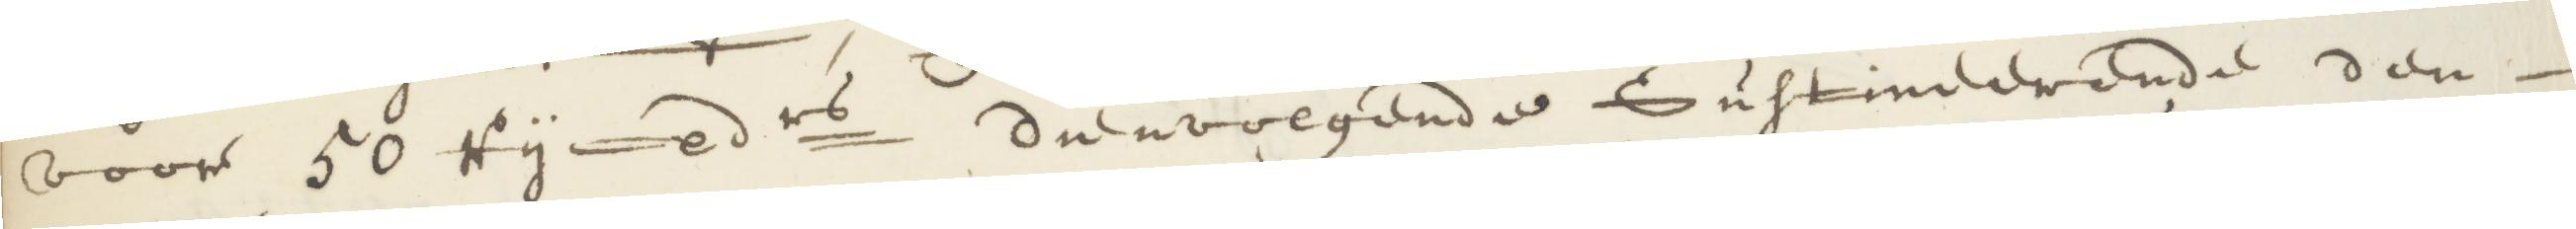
voor 50 Rijcxd=rs dienvolgende sustineerende den —
